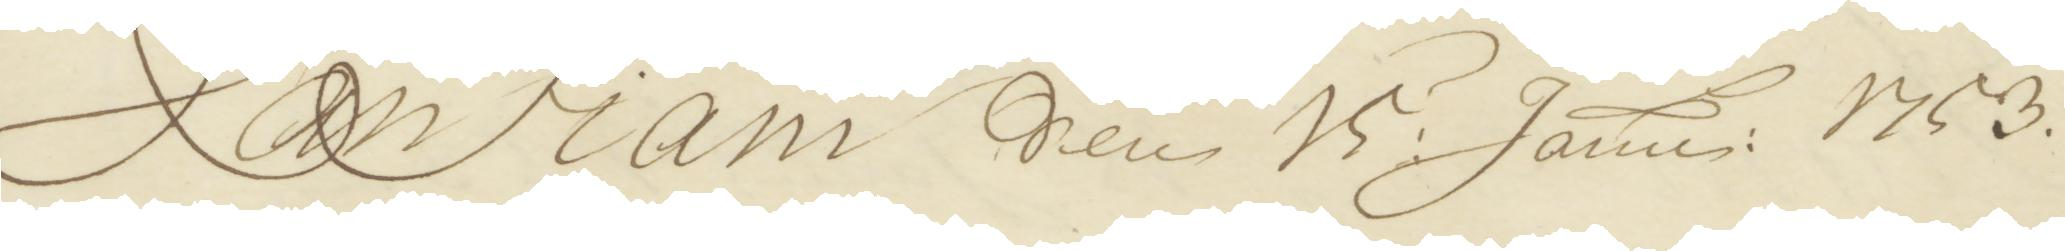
Van Siam den 15:' Janu: 1753.
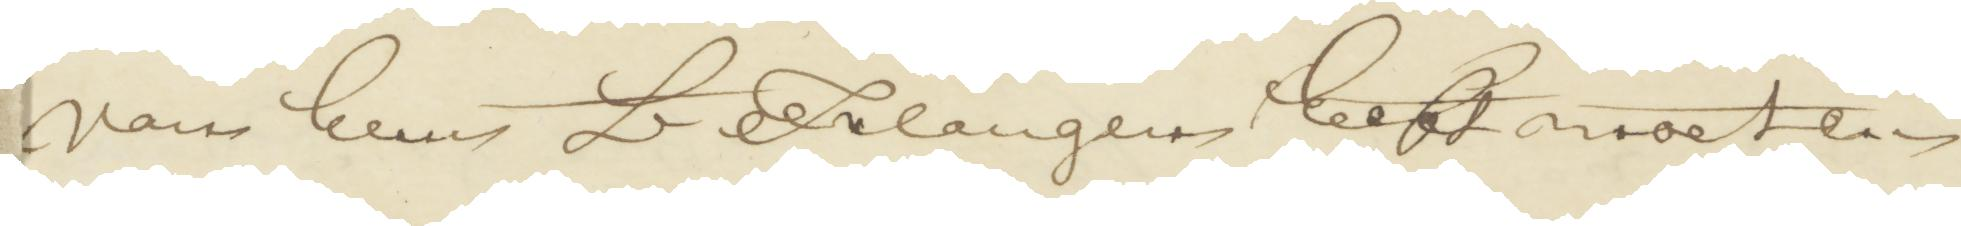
van hem te Erlangen, heeft moeten
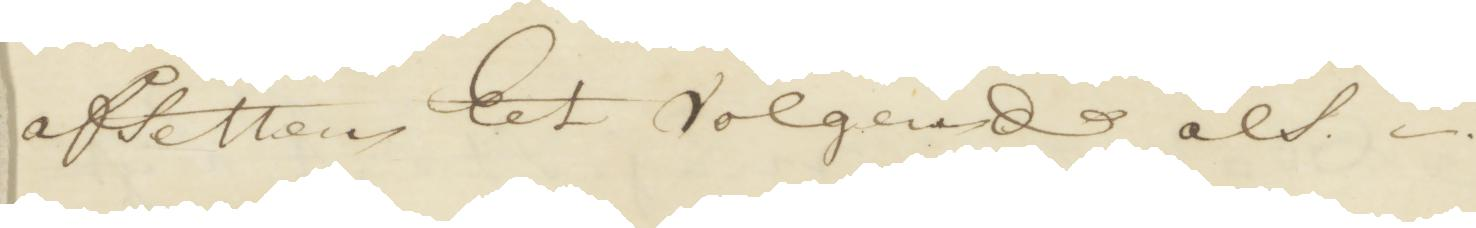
afsetten het volgende als.—.
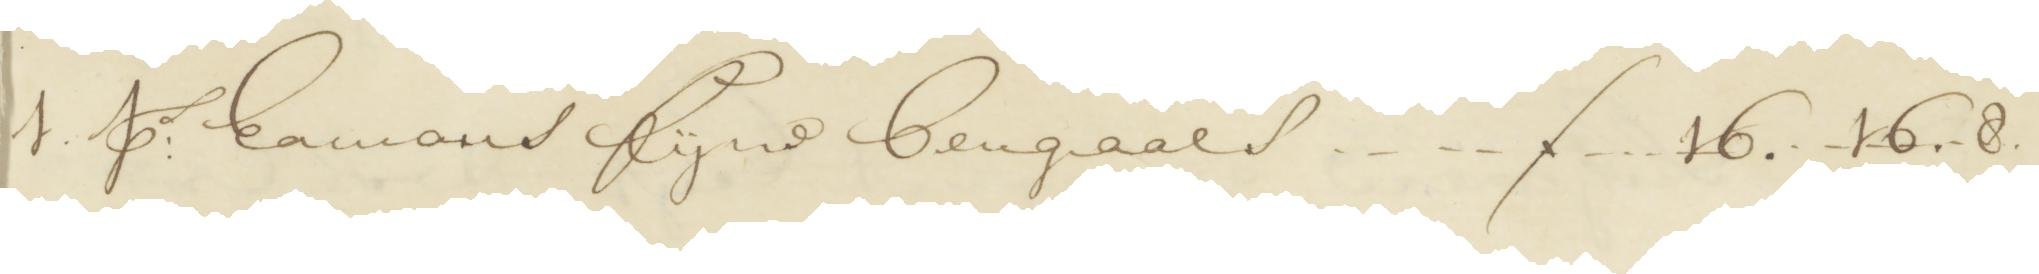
1. p:s hamans fijne bengaals ._ _ _ ƒ_.. 16.16._8.
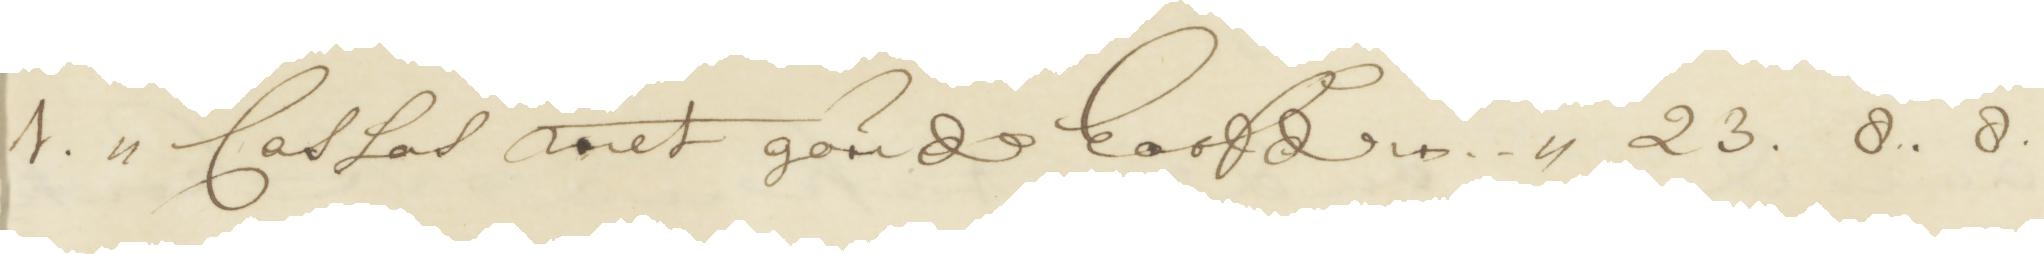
1. „ Cassas met goude hoofden ._ „ 23. 8. 8.
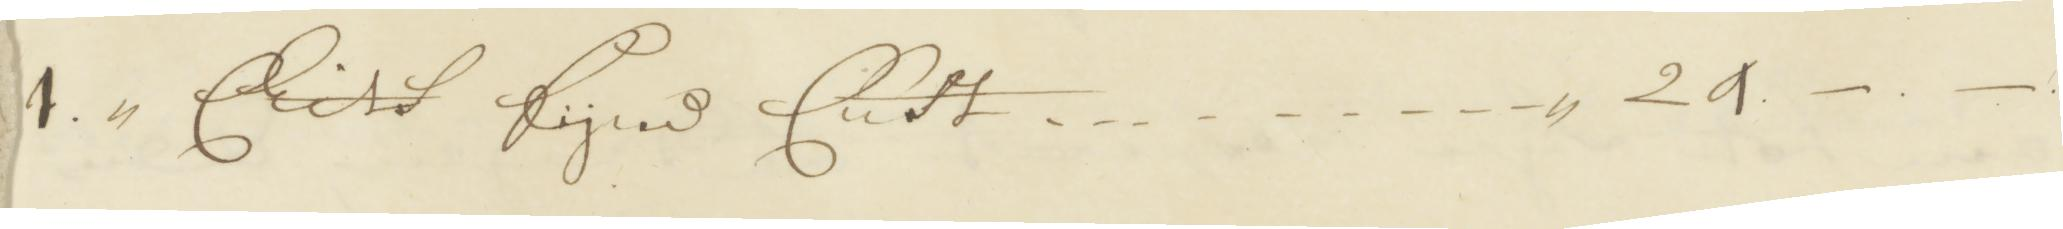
1. „ Chits fijne Cust _ _ _ _ _ _ _ _ _ „ 24. —. —.
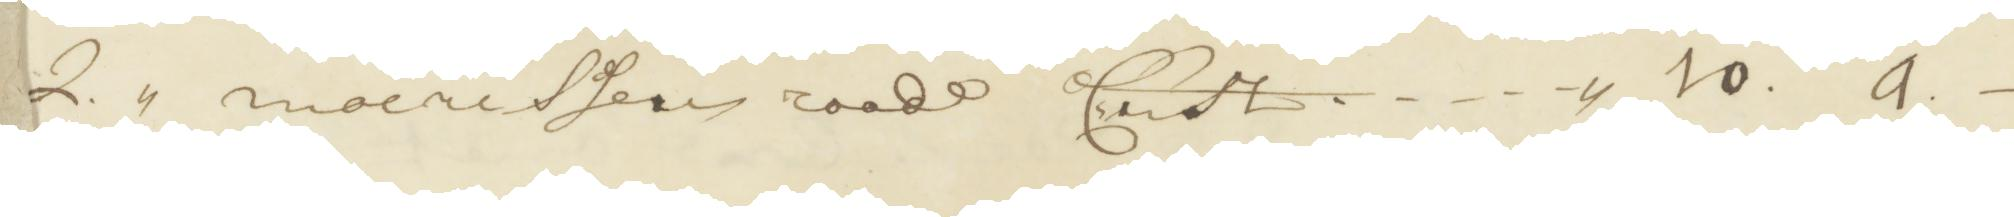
2. „ moerissen roode Cust . _ _ - - „ 10. 4. —.
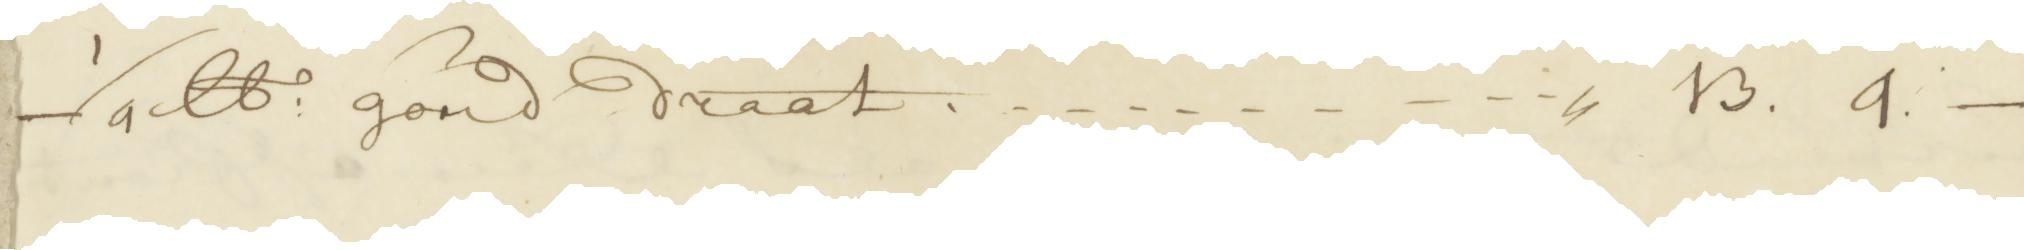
_ ¼ lb: goud draat . _ _ _ _ _ _ - - - „ 13. 4.—.
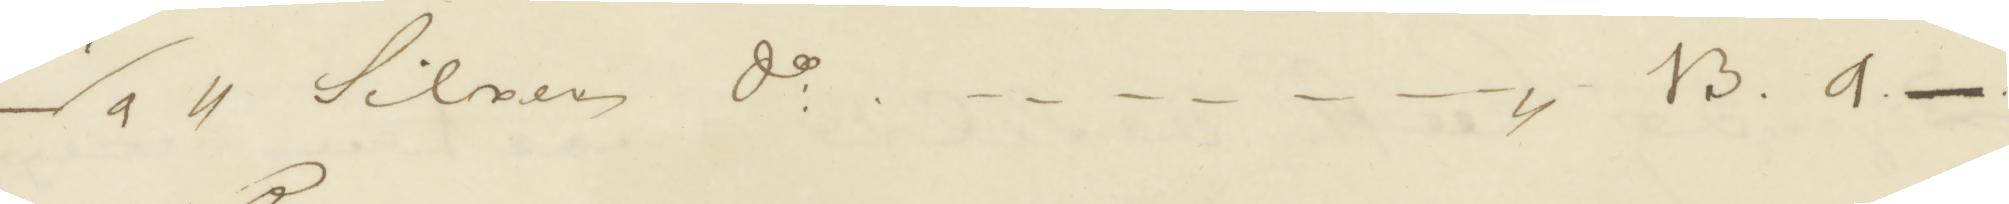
¼ „ silver d:o - - - - - - -„ 13. 4.—.
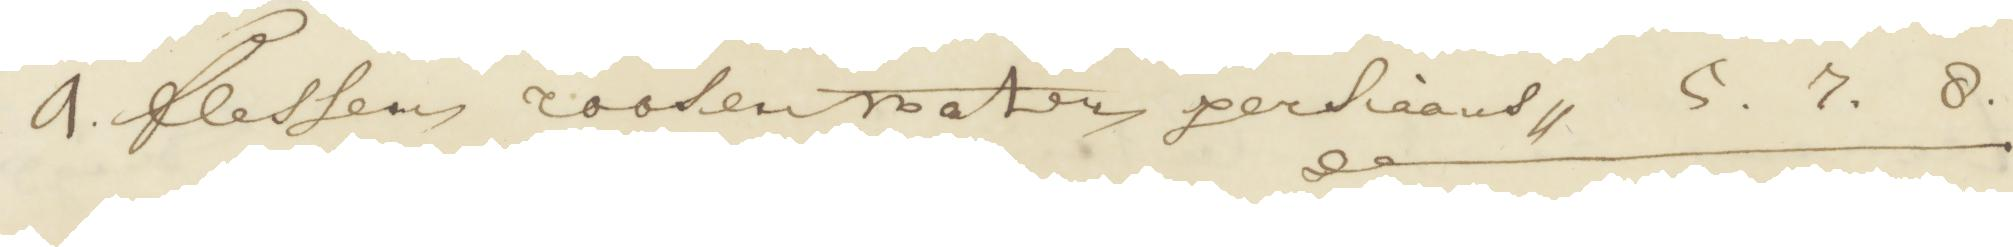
4. flessen roosen water persiaans „ 5. 7. 8.
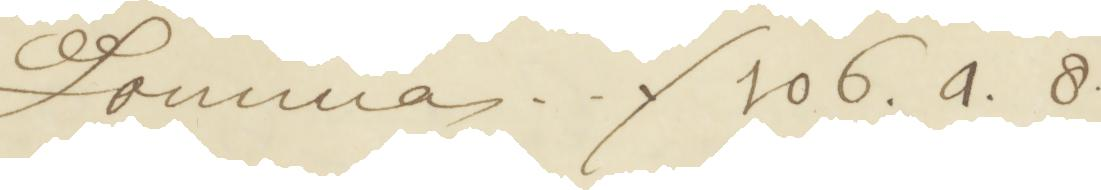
Somma - - ƒ 106.4.8.
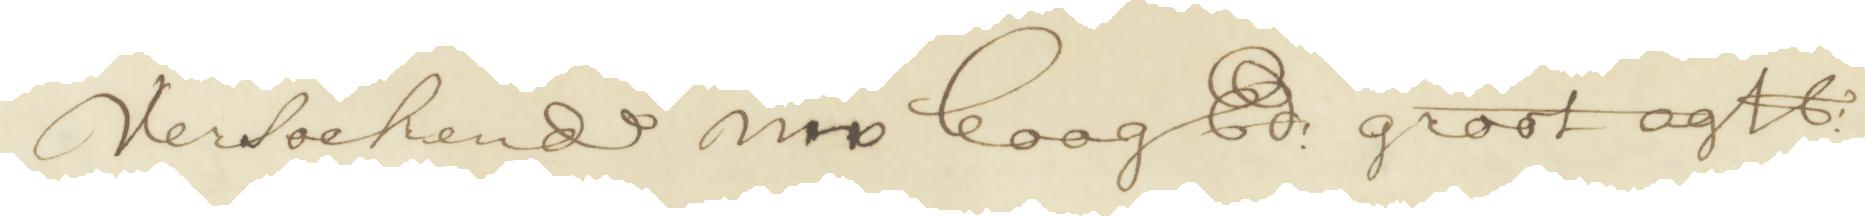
Versoekende uw hoog Ed: groot agtb:
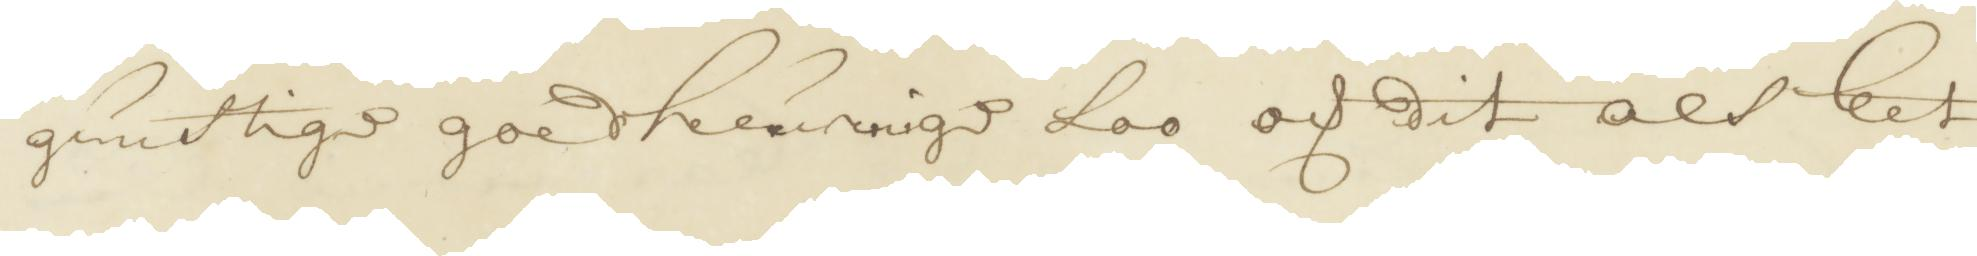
gunstige goedkeuringe soo over dit als het
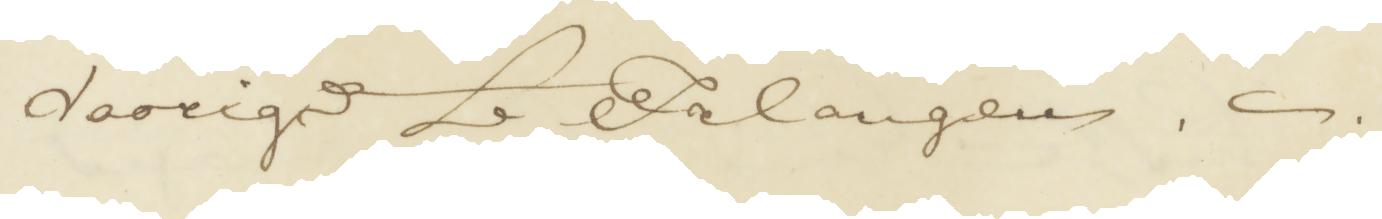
voorige te Erlangen .—.
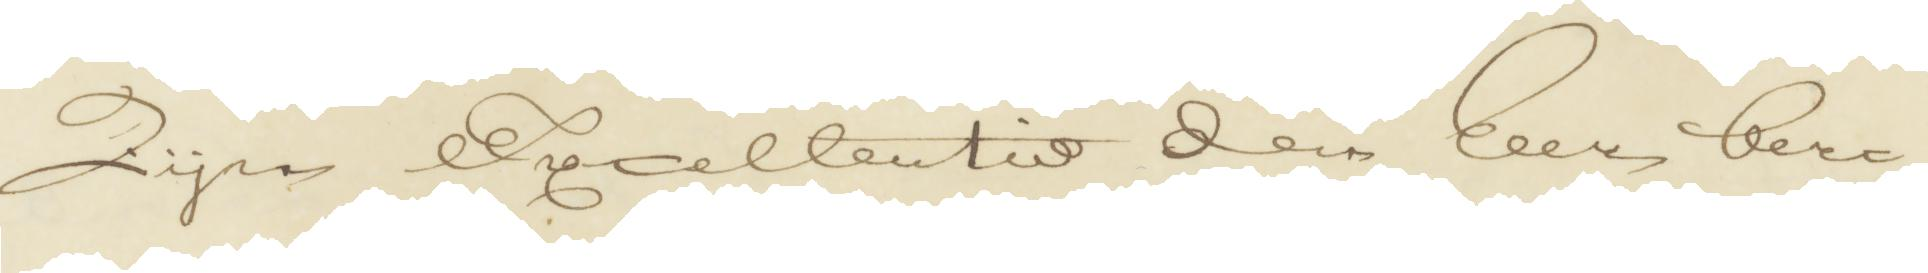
Zijn Excellentie den heer berc
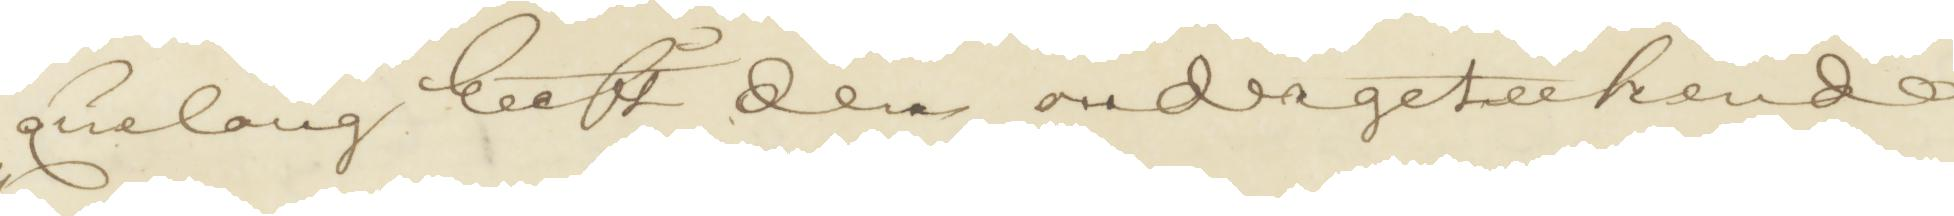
quelang heeft den ondergeteekende
